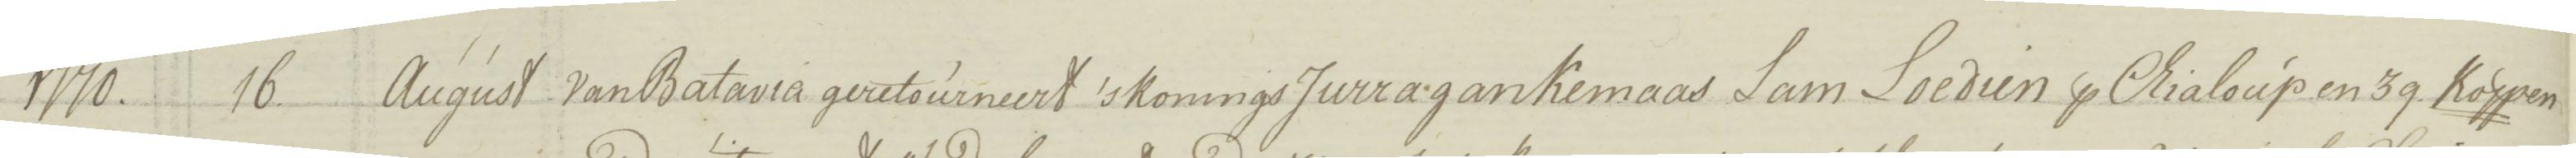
1770. 16 August van Batavia geretourneert ’s konings Jurragan Kemaas Lam Loedien p Chialoup en 39. koppen
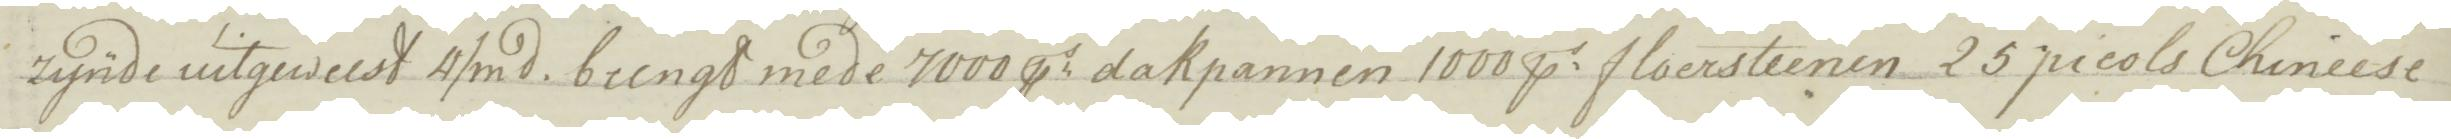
zijnde uitgeweest 4/md. brengt mede 7000 p„s dakpannen 1000 p,s floersteenen 25 picols Chineese
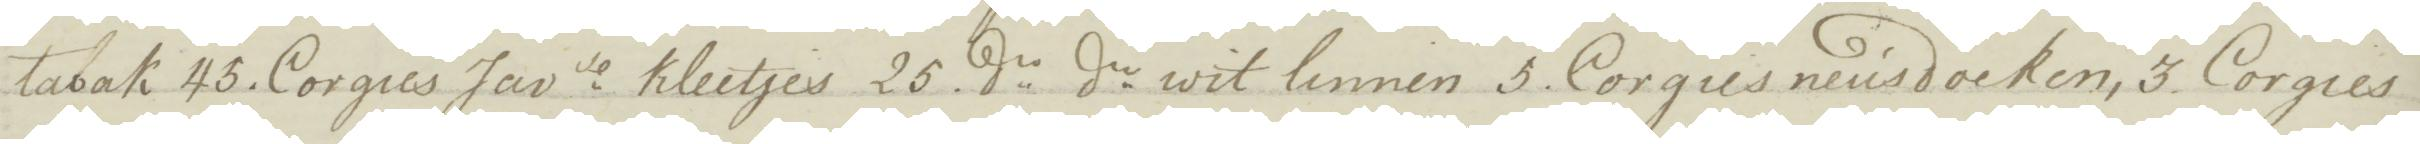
tabak 45. Corgies Jav„se kleetjes 25. d„o d„o wit linnen 5. Corgies neusdoeken, 3. Corgies
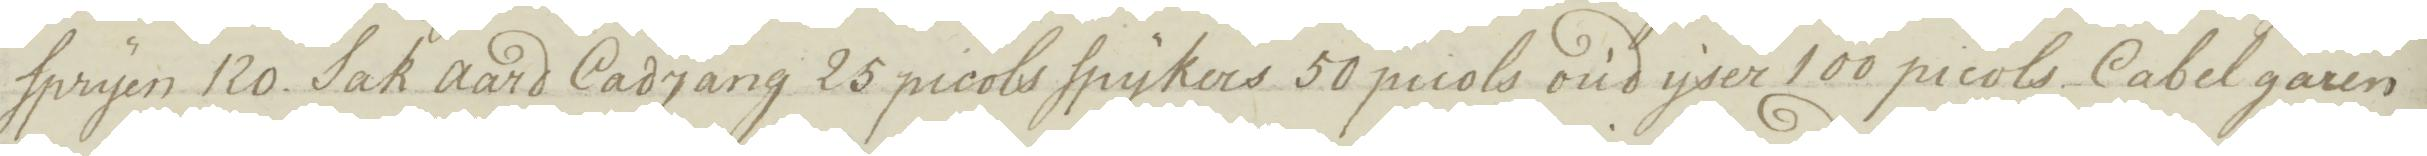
sprijen 120. sak aard Cadjang 25 picols spijkers 50 picols oud ijser 100 picols. Cabel garen
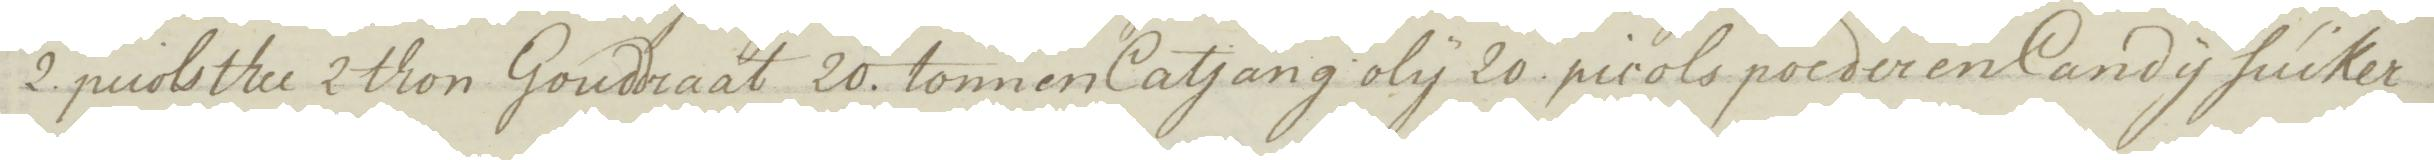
2. picols thee 2 thon Gouddraat 20. tonnen Catjang olij 20. picols poeder en Candij suiker
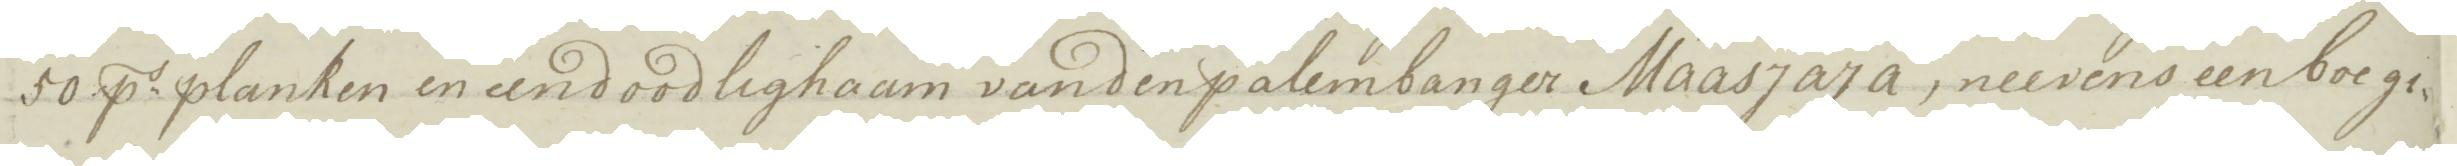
50 p„s planken en een dood lighaam van den palembanger Maasjaja, neevens een boegi,
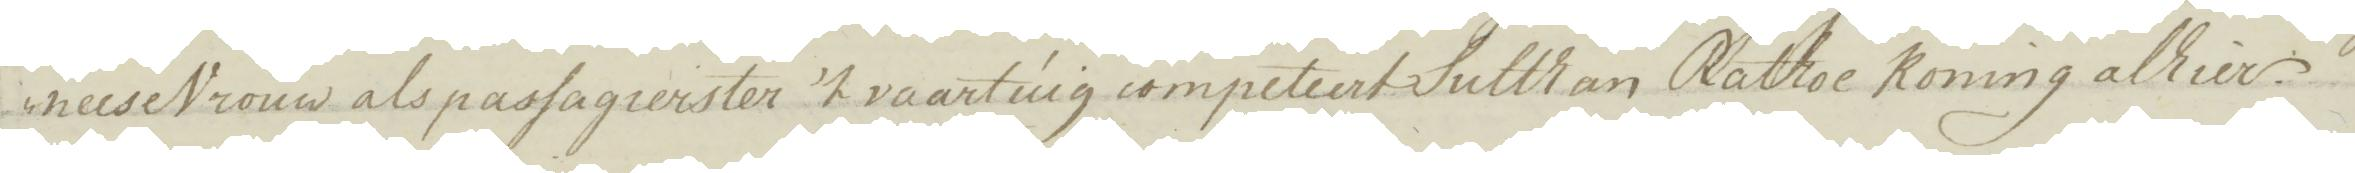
„neese vrouw als passagierster ’t vaartuig competeert sulthan Rathoe koning alhier.
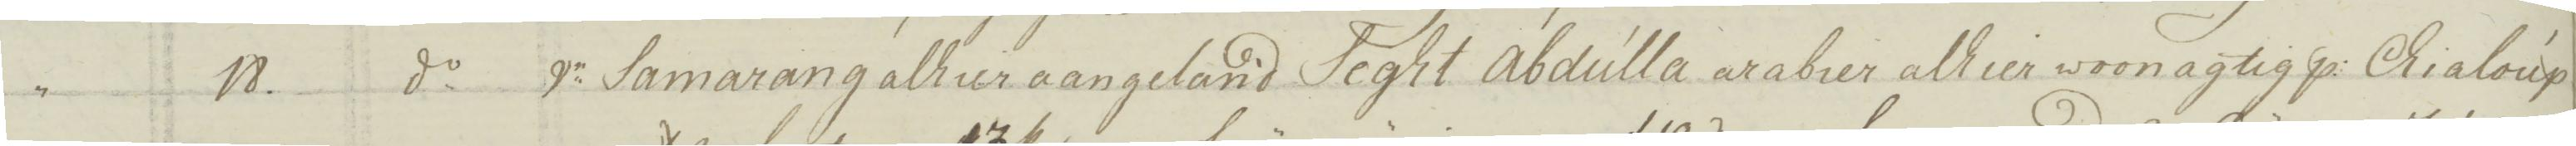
„ 18. d.o v„n Samarang alhier aangeland Seght Abdulla arabier alhier woonagtig p: Chialoup
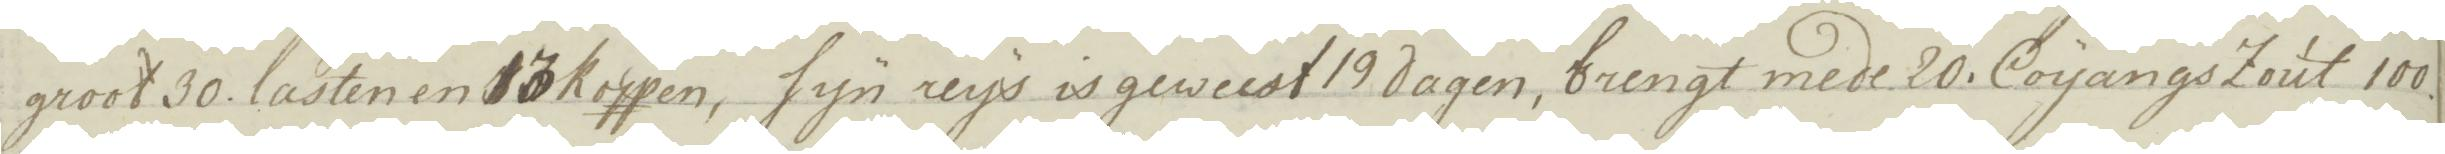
groot 30. lasten en 13 koppen, sijn reijs is geweest 19 dagen, brengt mede 20. Coijangs zout 100
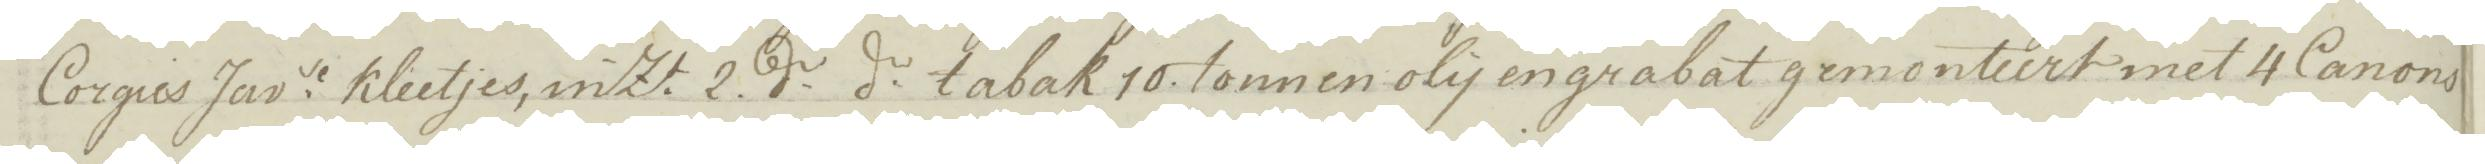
Corgies Jav.se kleetjes, inz.t 2. d„o d„o tabak 10. tonnen olij en grabat gemonteert met 4 Canons
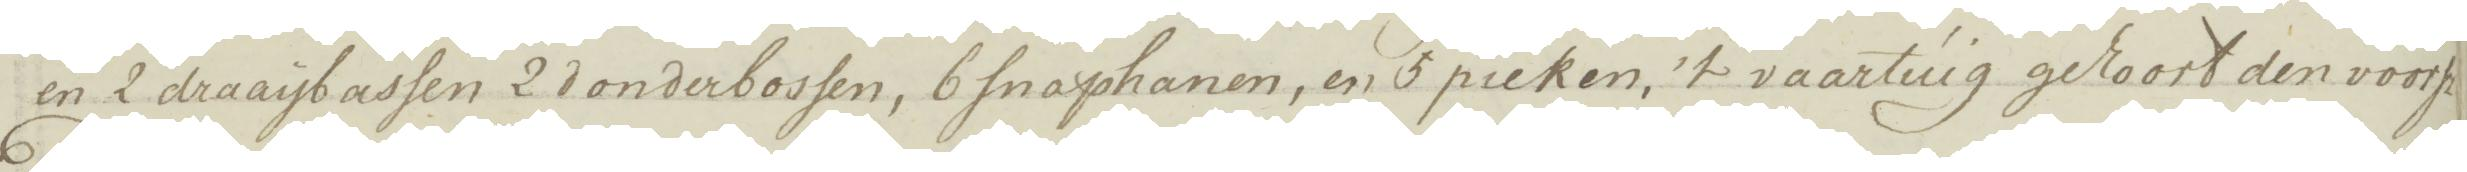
en 2 draaijbassen 2 donderbossen, 6 snaphanen, en 5 pieken, ’t vaartuig gehoort den voorsz
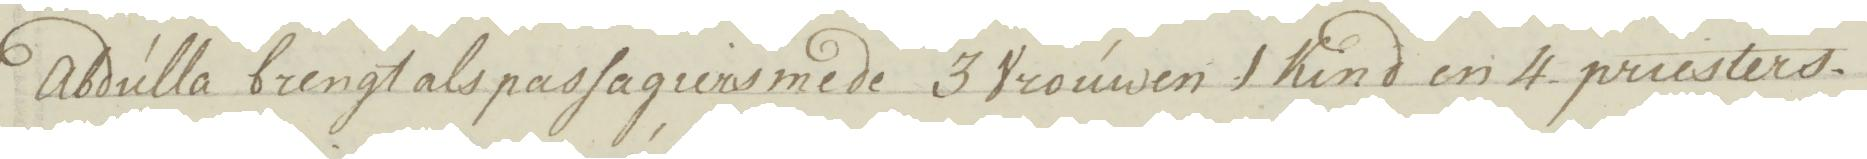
Abdulla brengt als passagiers mede 3 vrouwen 1 kind en 4. priesters.
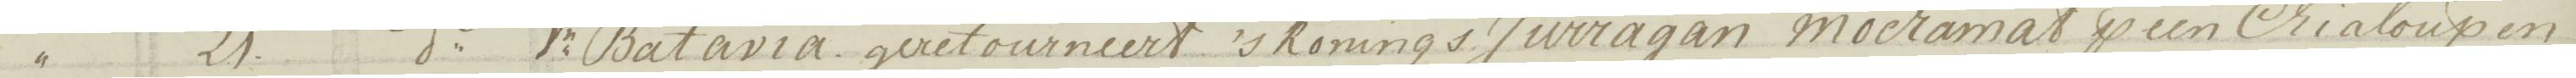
„ 21. d„o v„n Batavia geretourneert ’s konings Jurragan mochamat p een Chialoup en
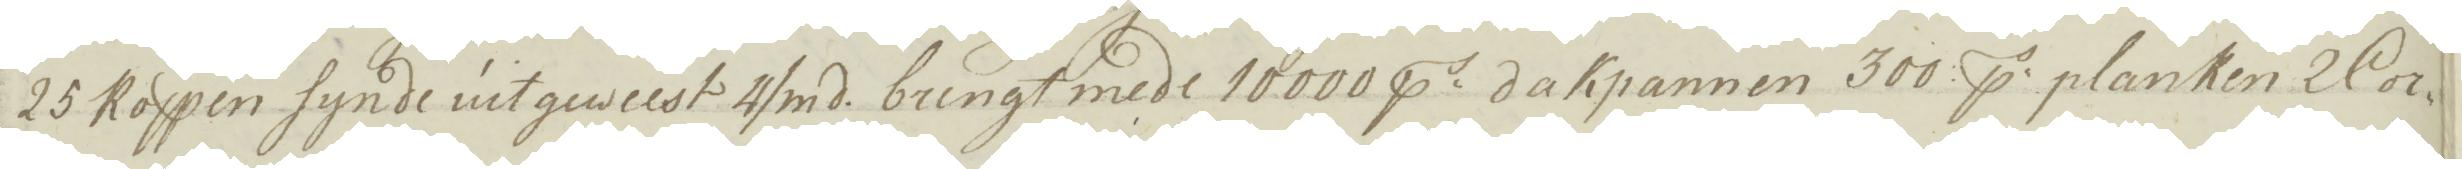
25 koppen synde uitgeweest 4/md. brengt mede 10000 p„s dakpannen 300: p„s planken 2 Cor„
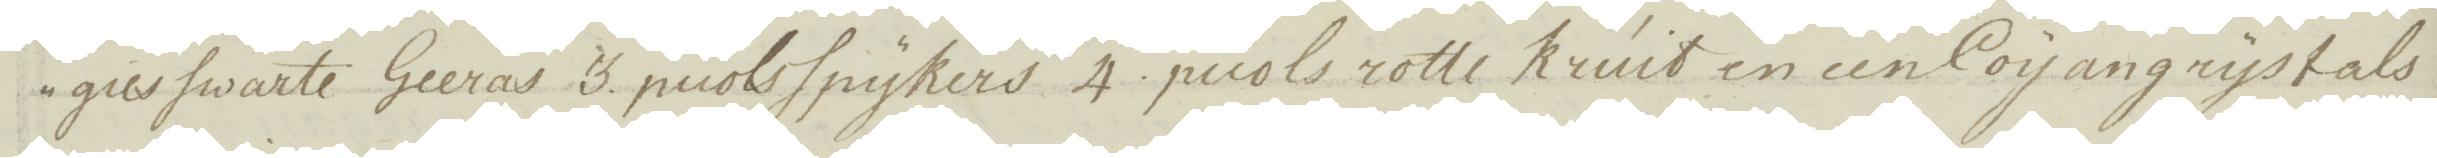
„gies swarte Geeras 3. picols spijkers 4. picols rotte kruit en een Coijang rijst als
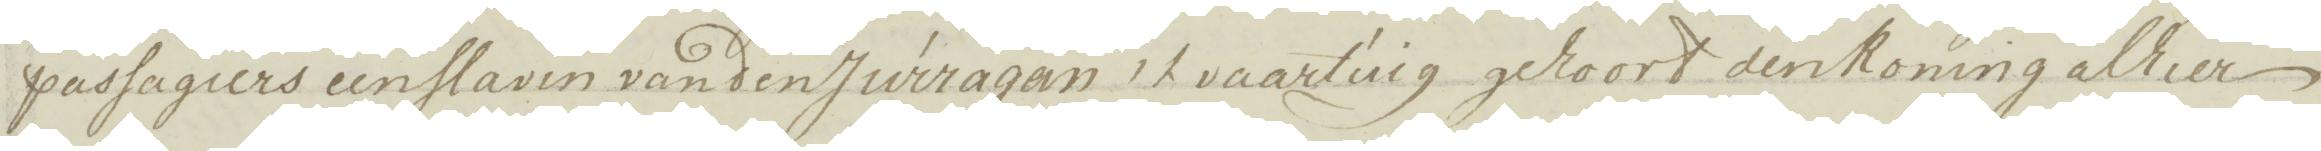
passagiers een slavin van den Jurragan 't vaartuig gehoort den koning alhier
